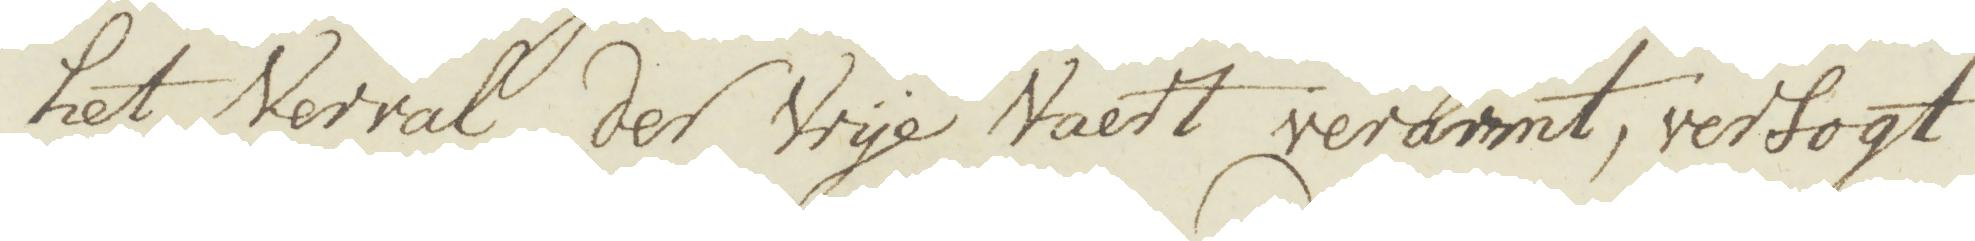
het verval der vrije vaert verarmt, versogt
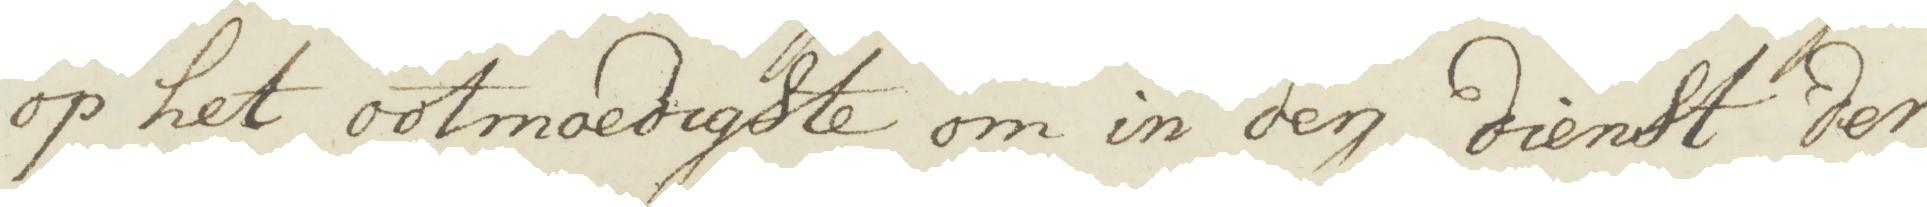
op het ootmoedigste om in den dienst der
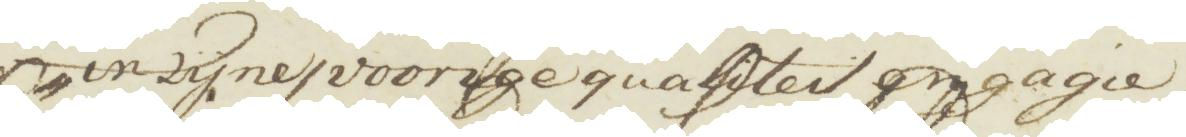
in zijne voorige qualiteit en gagie
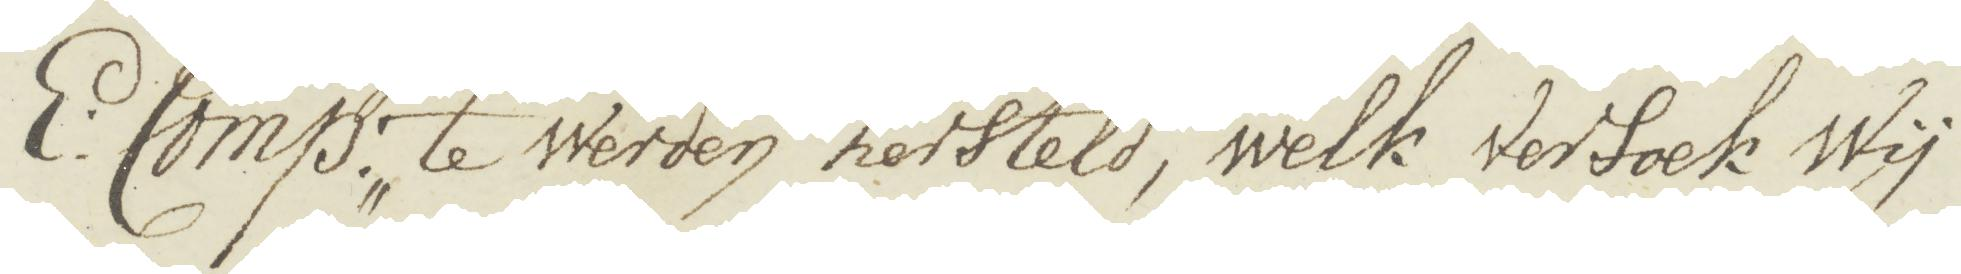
E: Comp:„ te werden hersteld, welk versoek wij
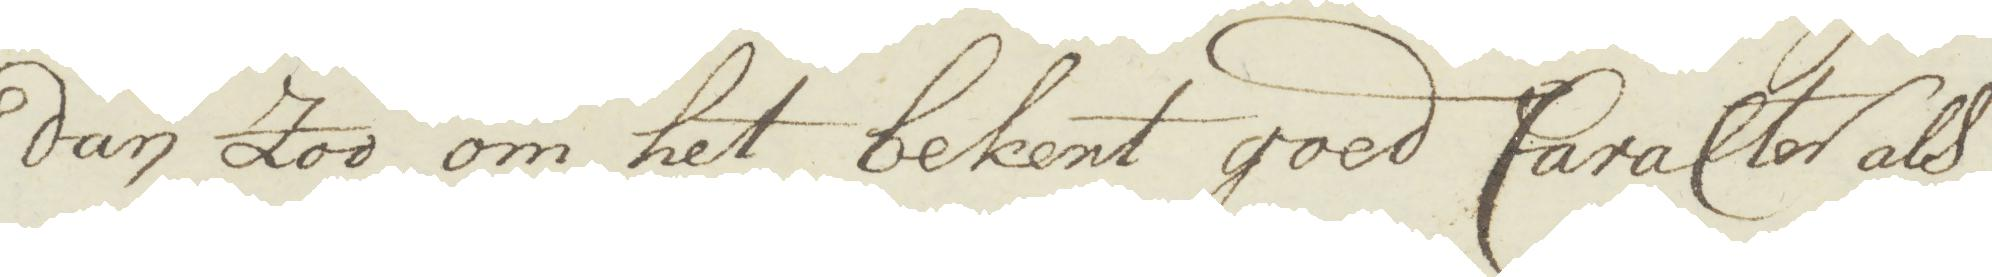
dan zoo om het bekent goed Caracter als
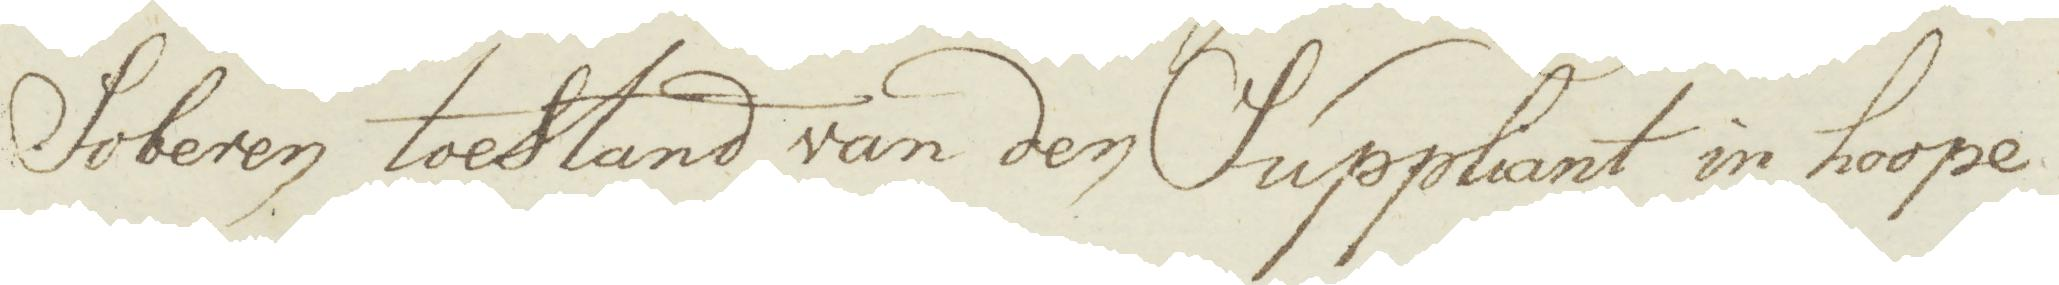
soberen toestand van den supplant in hoope
